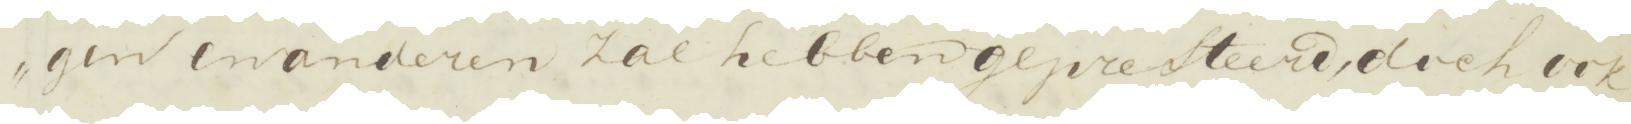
„gen en anderen zal hebben gepresteerd, doch ook
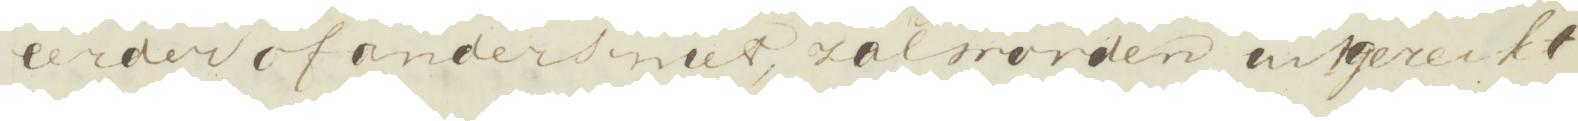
eerder of anders niet, zal worden uitgereikt
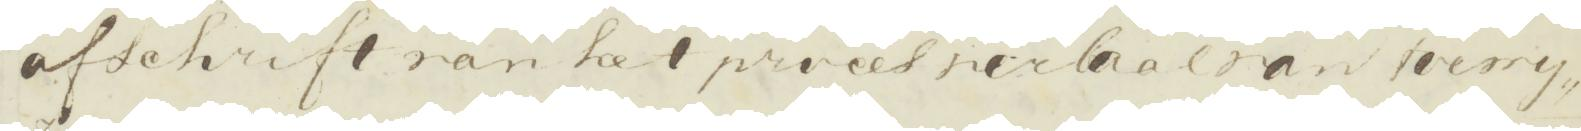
afschrift van het proces verbaal van toewy„
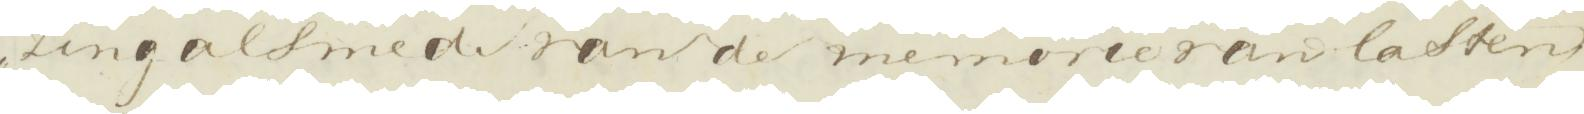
„zing alsmede van de memorie van lasten
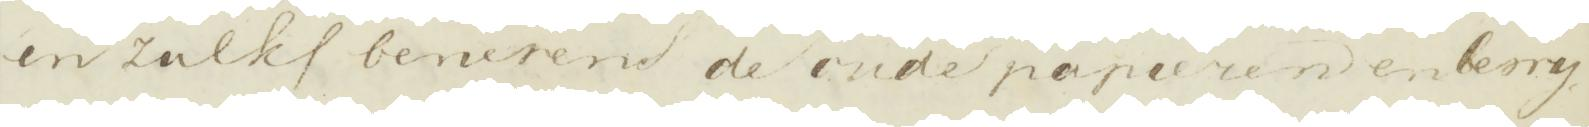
en zulks benevens de oude papieren en bewy
